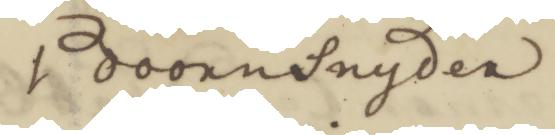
1 doornsnyder
